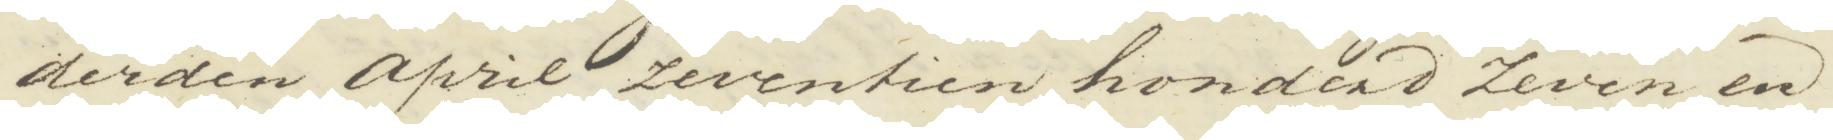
derden April zeventien honderd zeven en
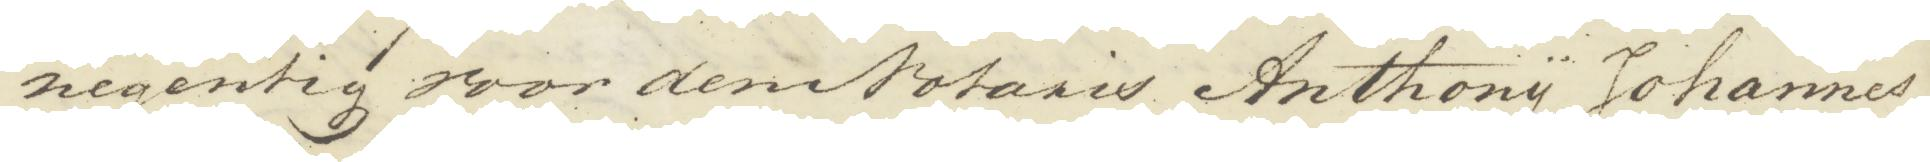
negentig voor den Notaris Anthonij Johannes
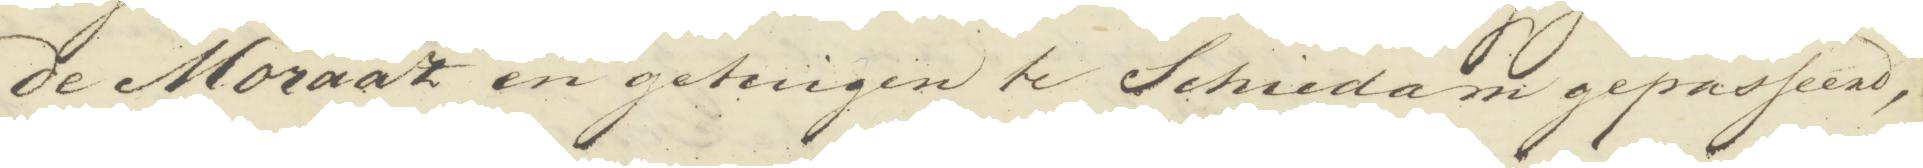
de Moraaz en getuigen te Schiedam gepasseerd,
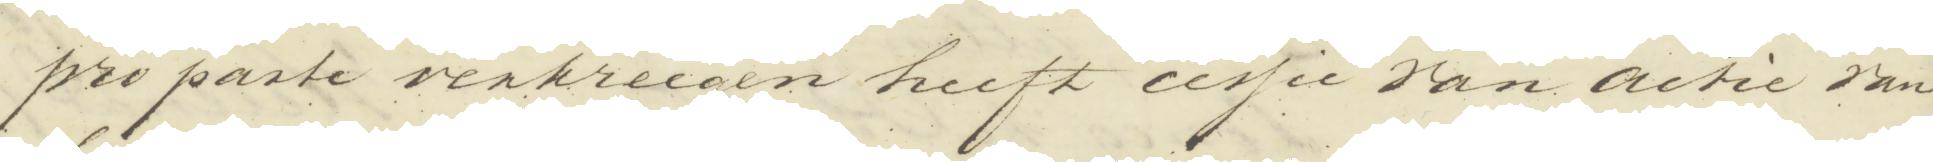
pro parte verkreegen heeft cessie van actie van
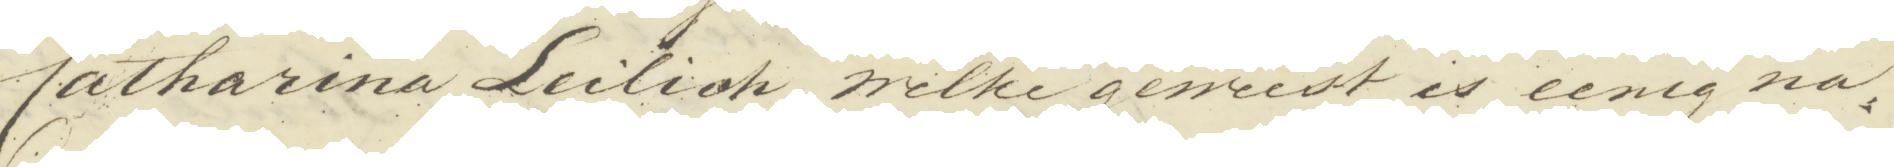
Catharina Leilich, welke geweest is eenig na
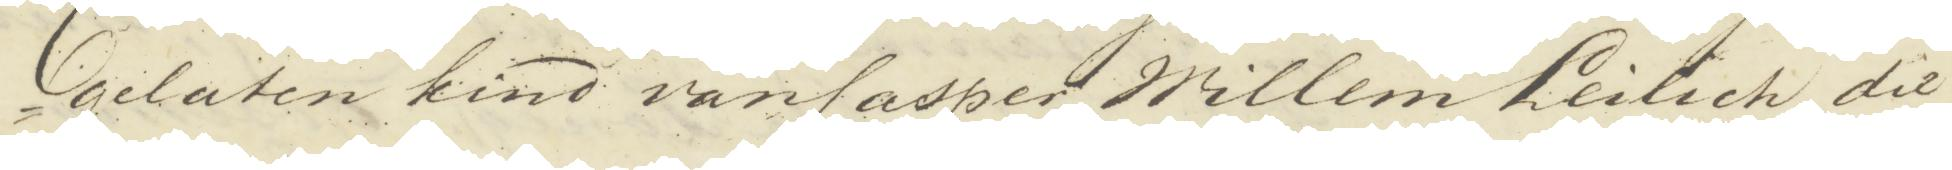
gelaten kind van Casper Willem Leilich, die
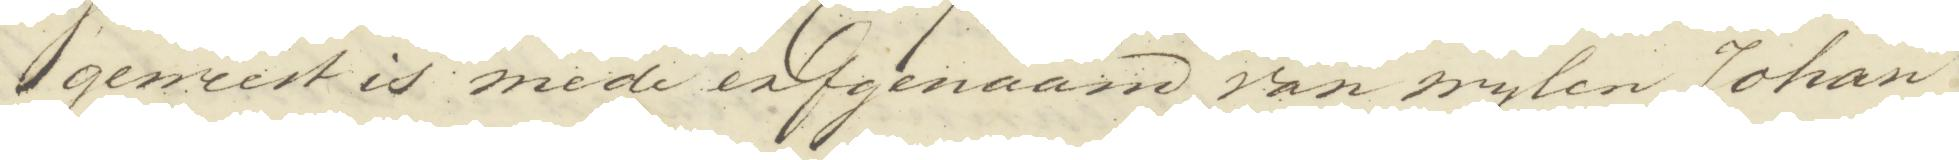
geweest is mede erfgenaam van wylen Johan
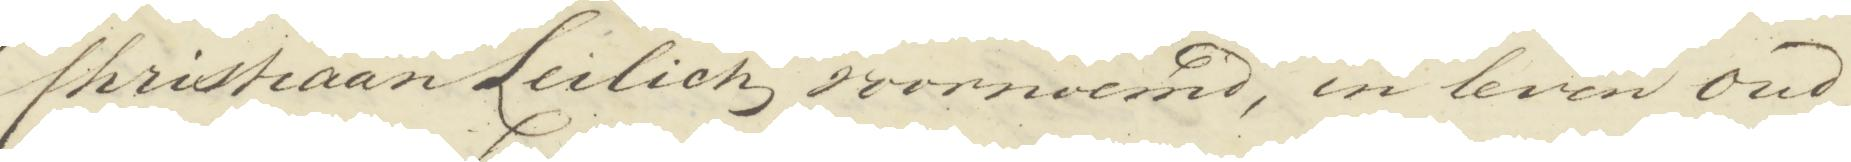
Christiaan Leilich voornoemd, in leven oud
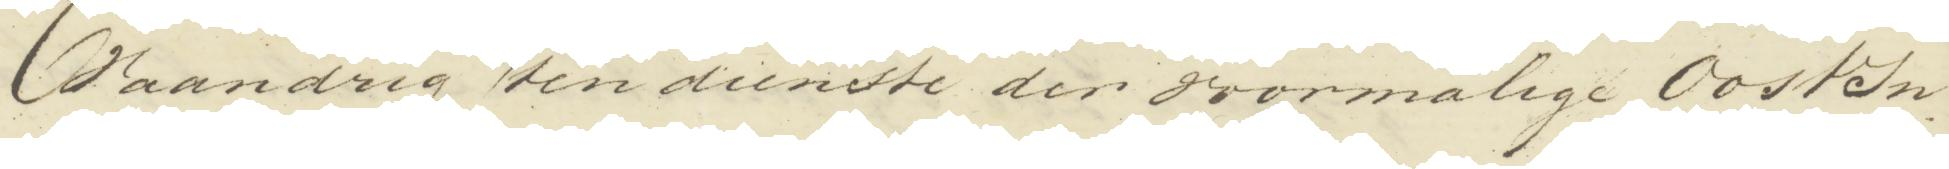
Vaandrig ten dienste der voormalige Oost In
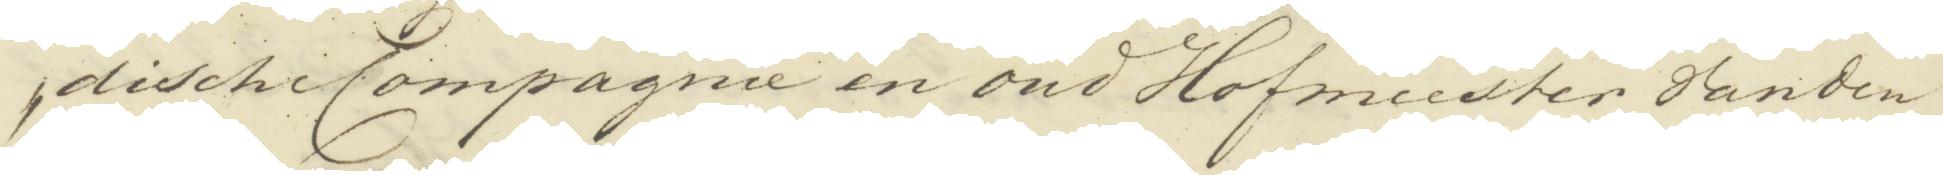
„dische Compagnie en oud Hofmeester van den
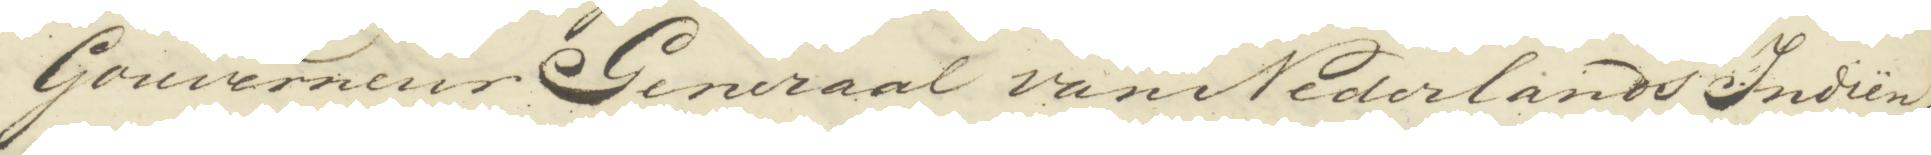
Gouverneur Generaal van Nederlands Indiën
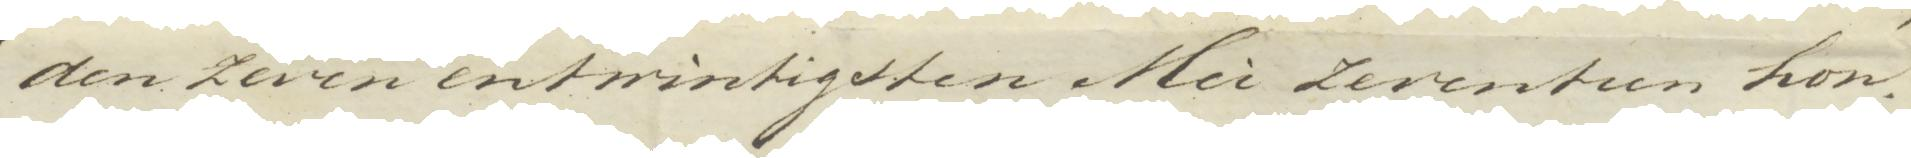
den zeven en twintigsten Mei zeventien hon„
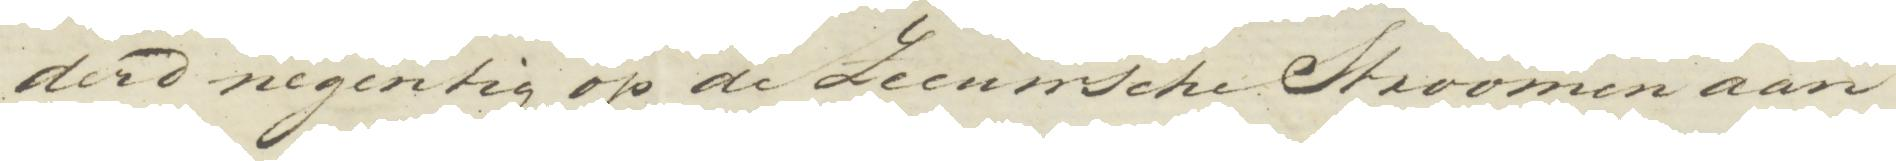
derd negentig op de Zeeuwsche stroomen aan
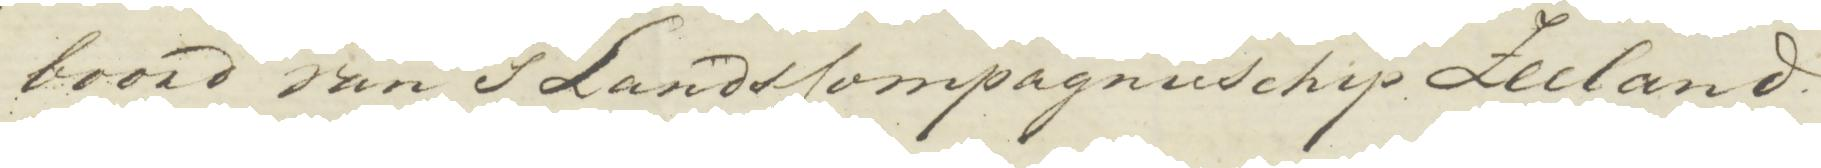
boord van 's Lands Compagnieschip Zeeland
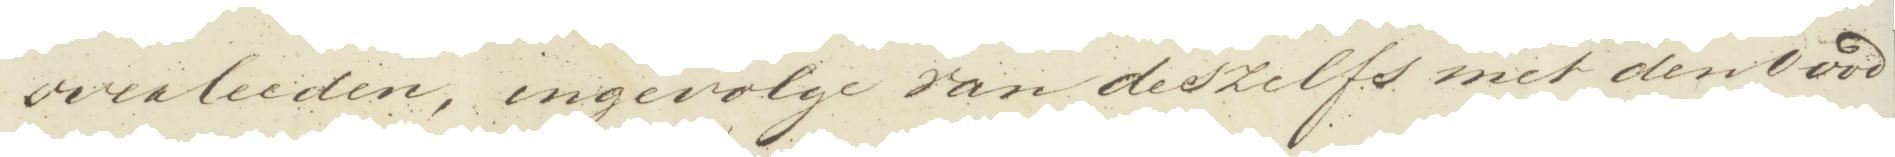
overleeden, ingevolge van deszelfs met den dood
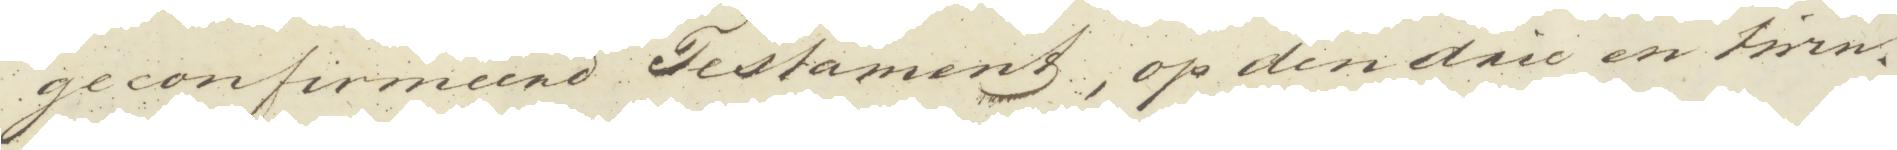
geconfirmeerd Testament, op den drie en twin
